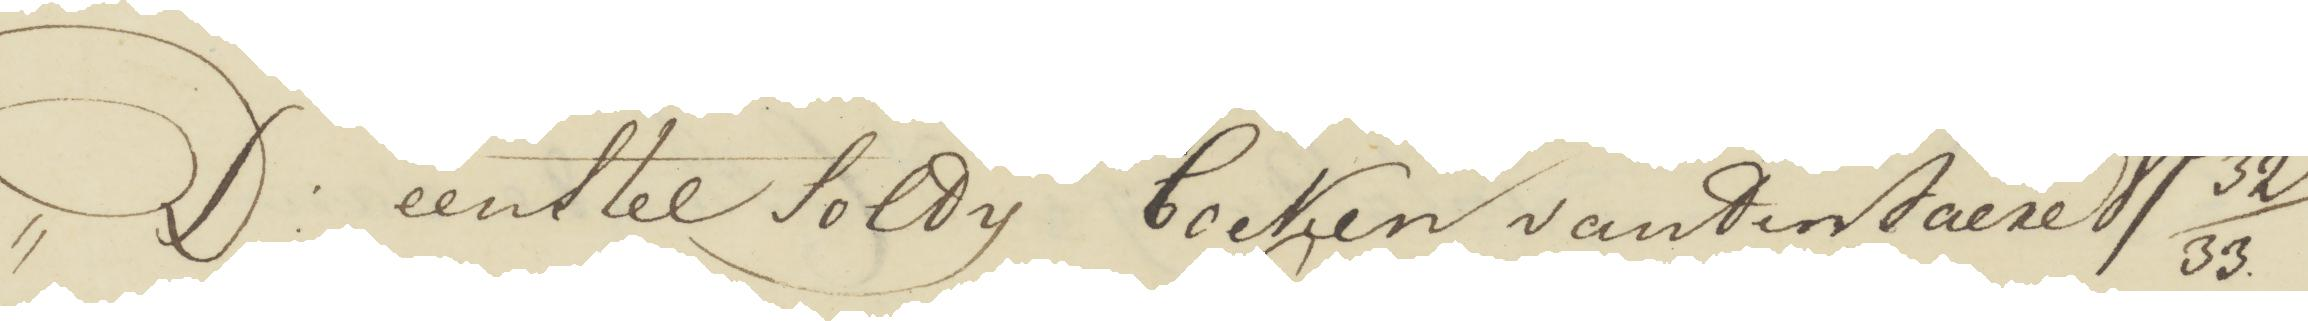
„ D: eenstel soldij boeken van ten Jaere 17 32/33.
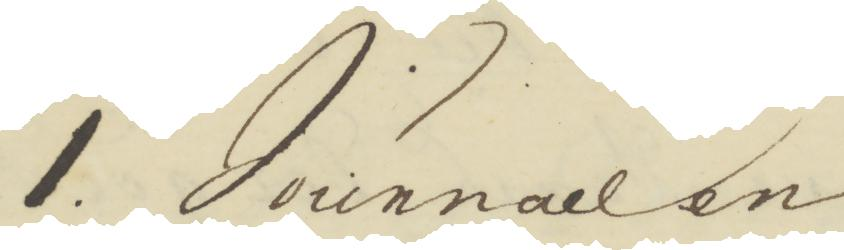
1 Journael en
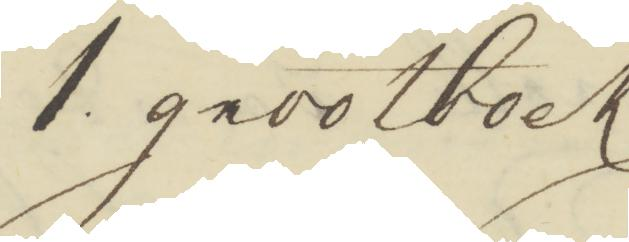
1. grootboek
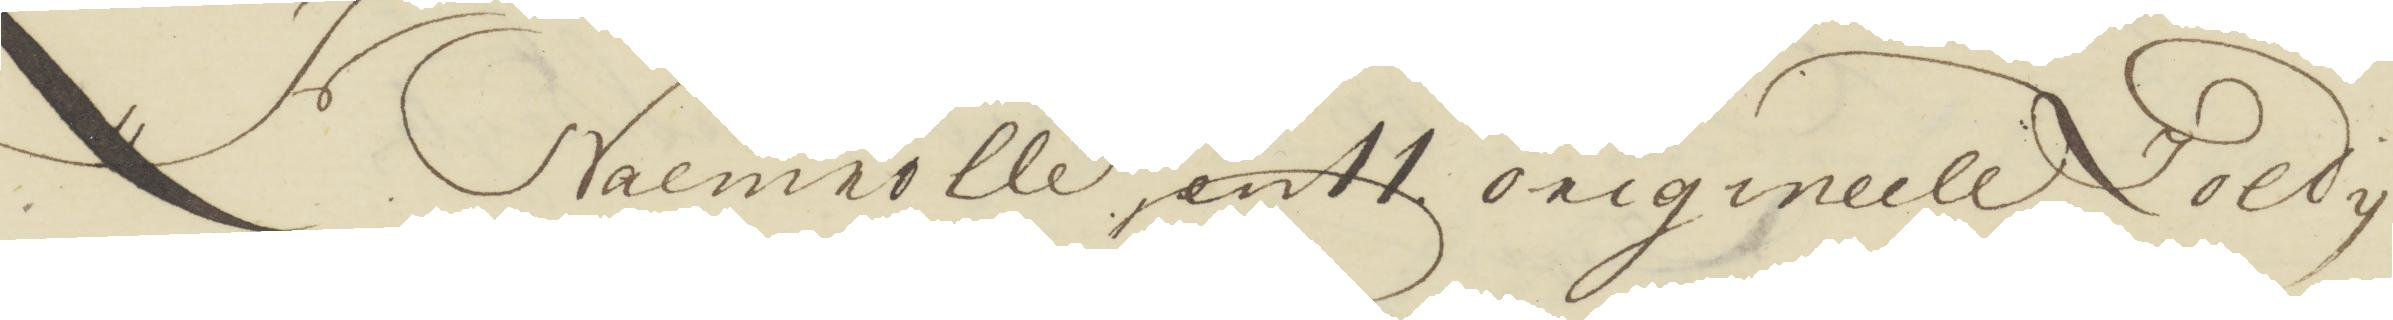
Ls Naemrolle en 11 origineele zoldij
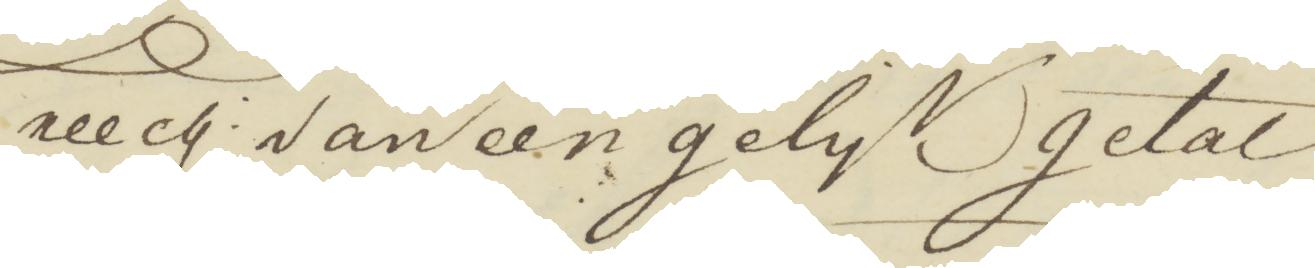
reecq: van een gelijk getal
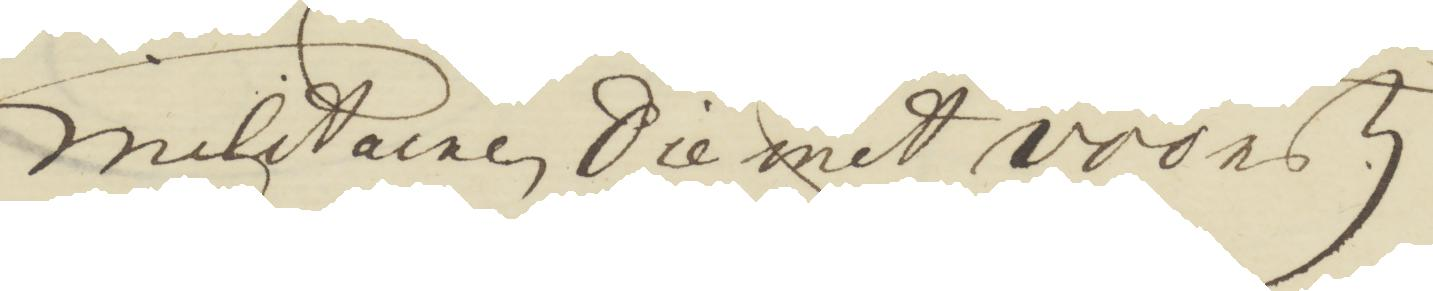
militairen die met voorsz:
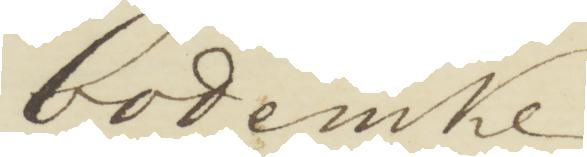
bodemke
